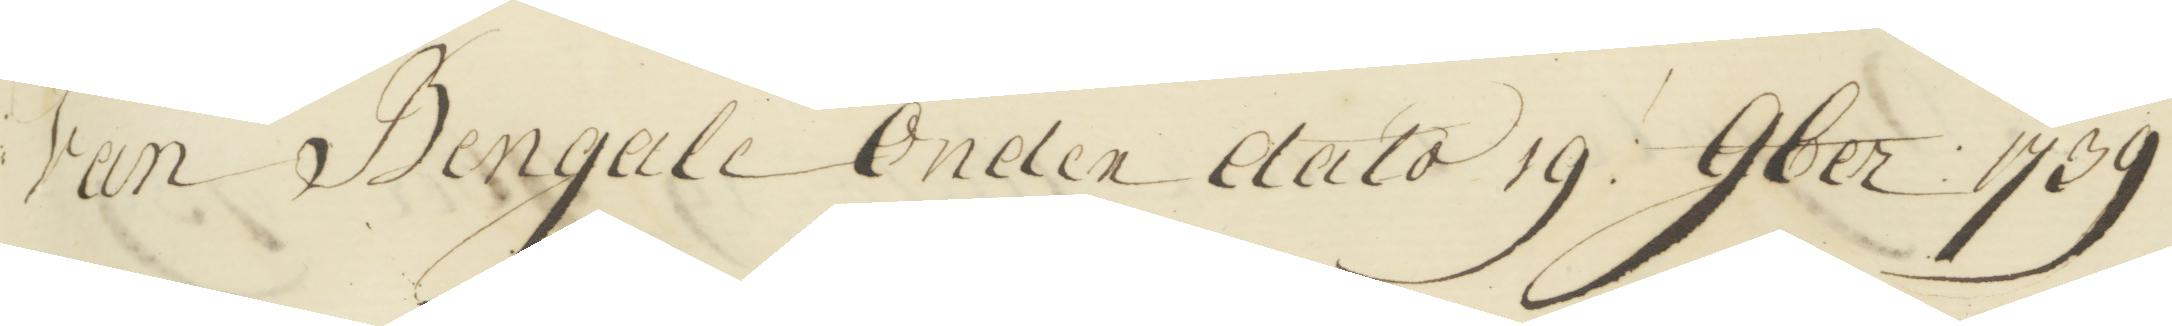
Van Bengale onder dato 19:' 9ber: 1739:
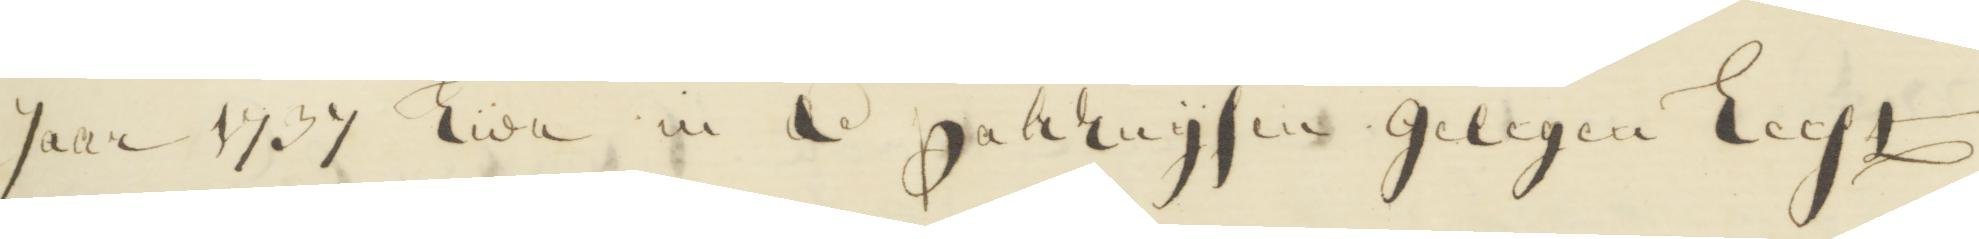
Jaar 1737 hier in de pakhuijsen gelegen heeft
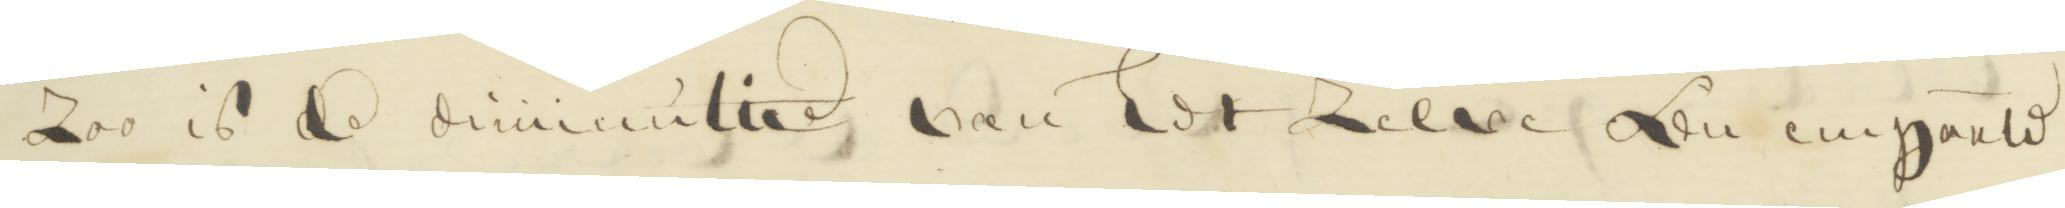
zoo is de diminutie van het zelve ten emporte
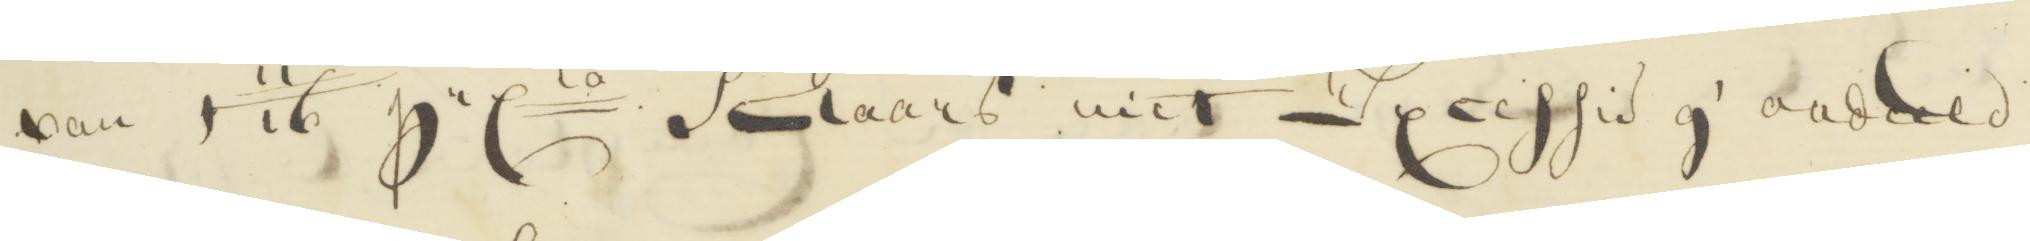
van 1 11/16 prC=to schaars niet Excessie g’ordeeld,
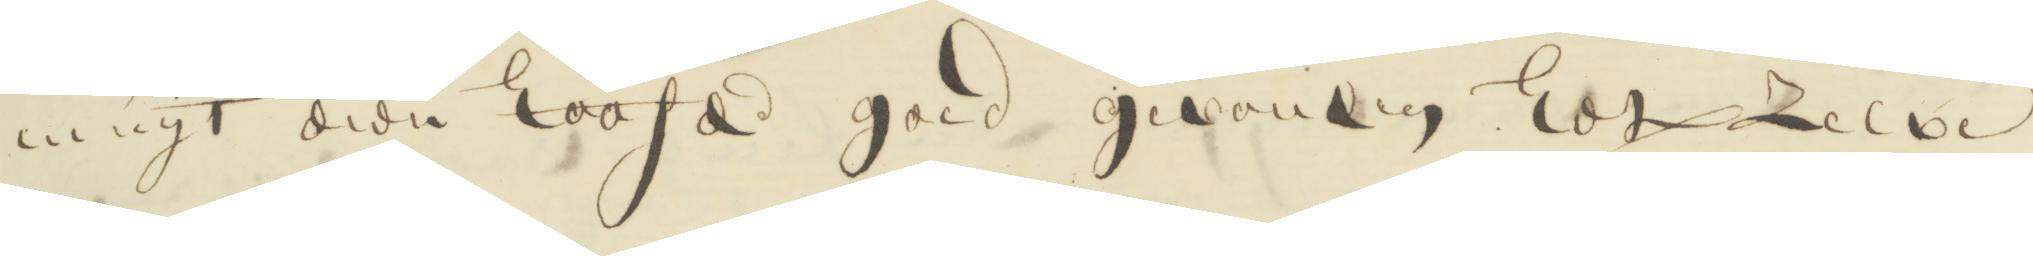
en uijt dien hoofde goed gevonden het zelve
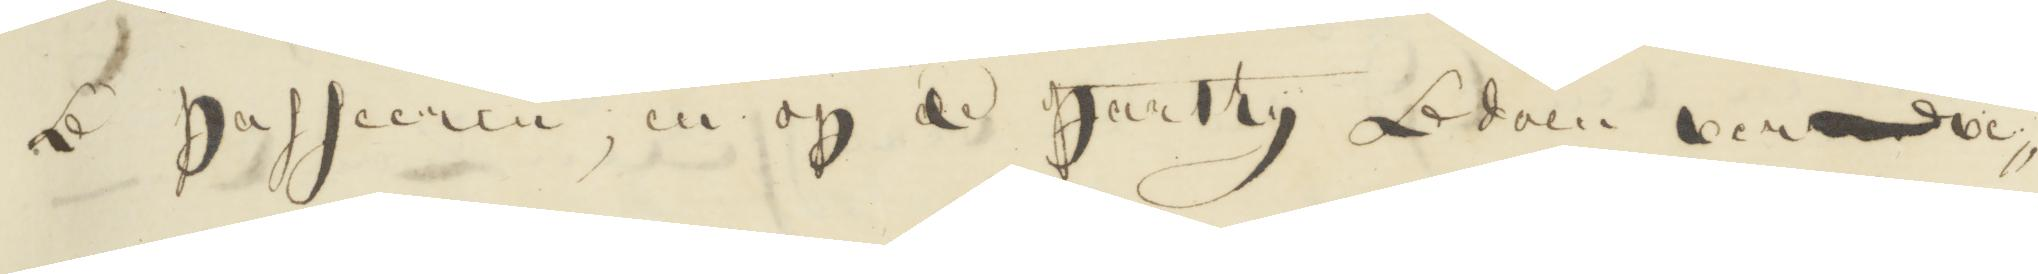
te passeeren, en op de parthij te doen vereve„
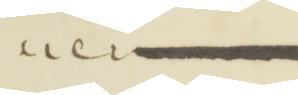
nen.,
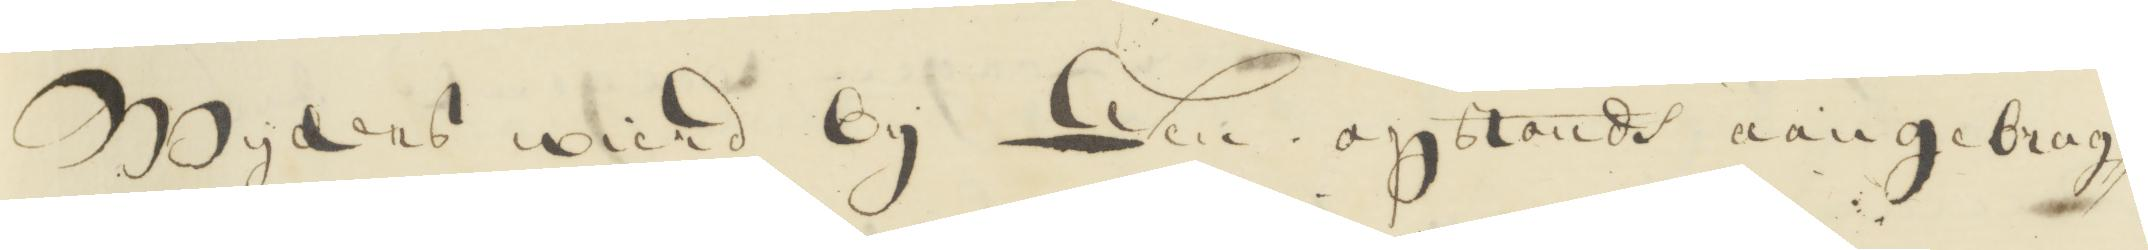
Wijders wierd bij Een opstands aangebrag„
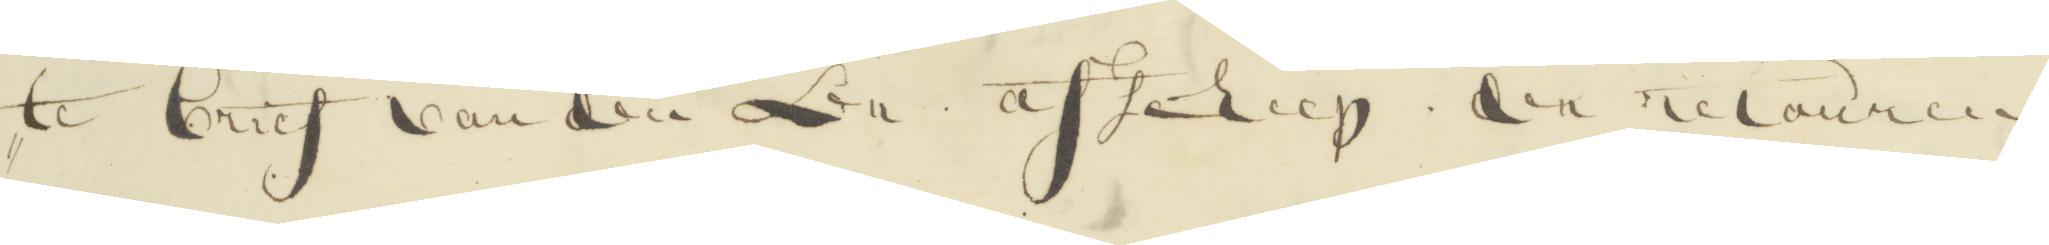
„te brief van den ter afscheep der retouren
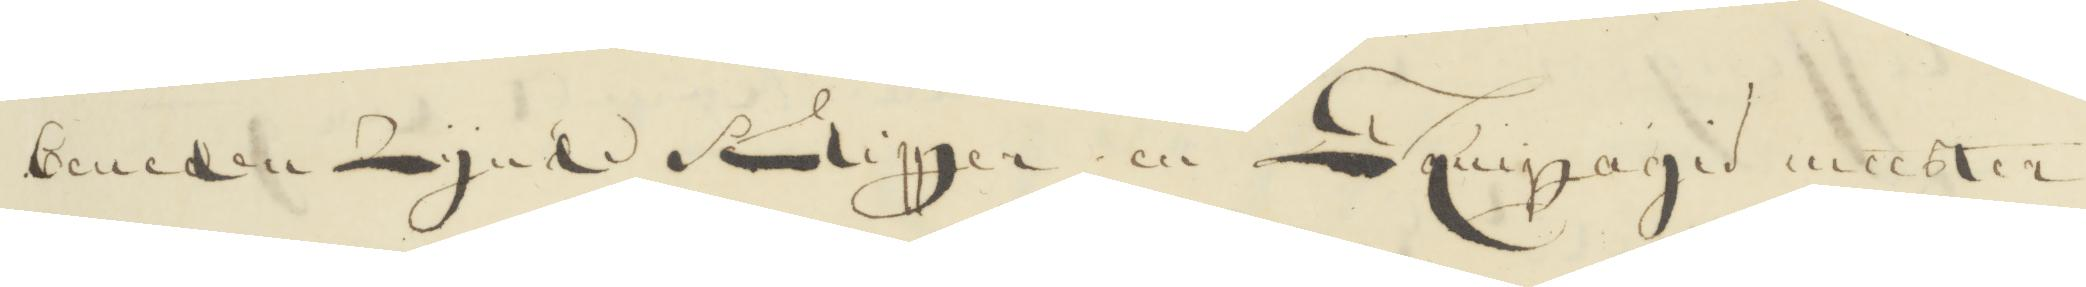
beneden zijnde schipper en Equipagie meester
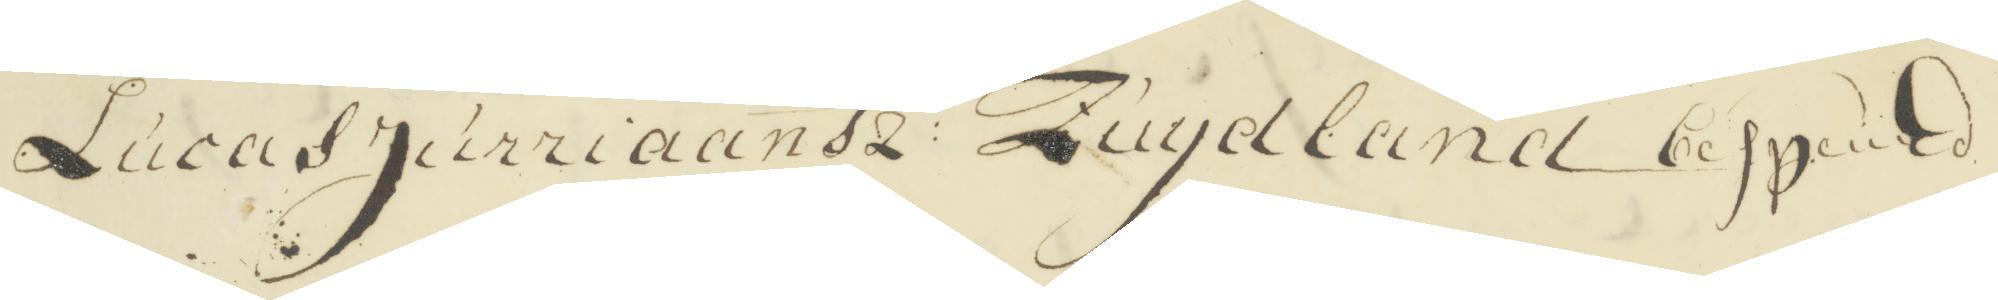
Lucas Jurriaansz: Zuydland bespeurd
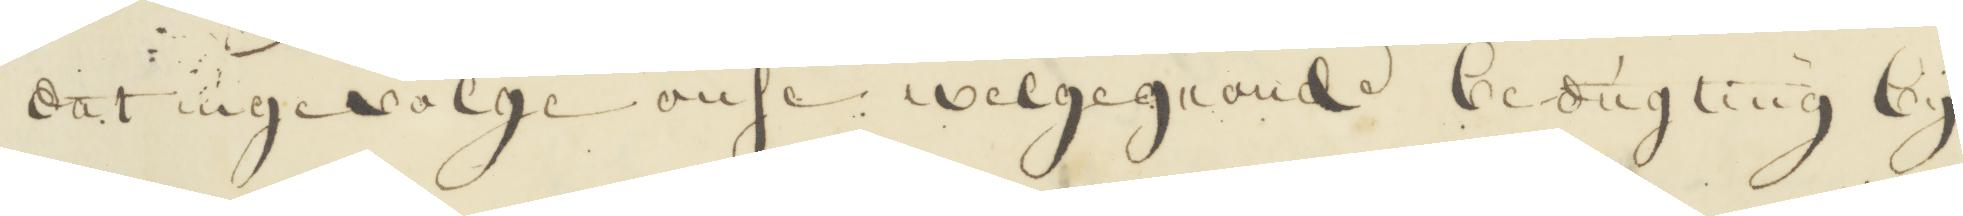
dat ingevolge onse: welgegronde bedugting bij
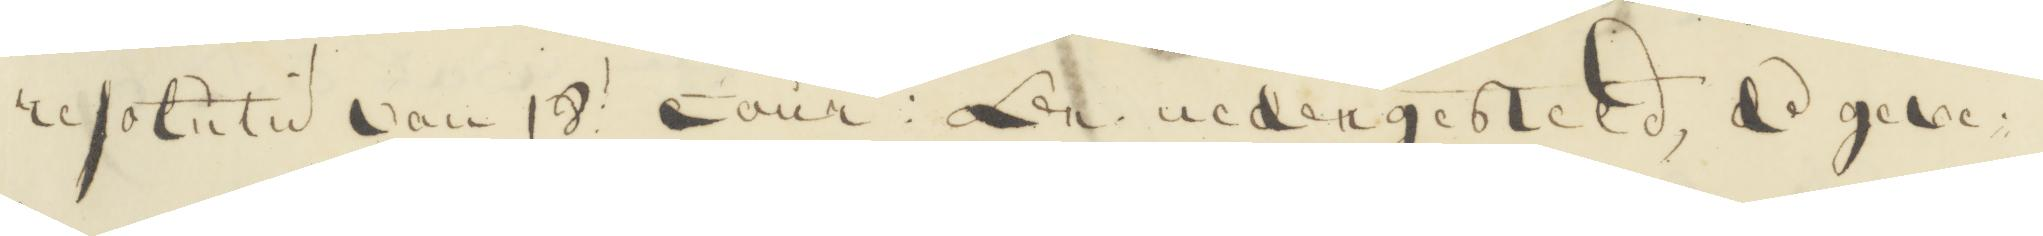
resolutie van 18:' cour:t ter nedergesteld, de geve„
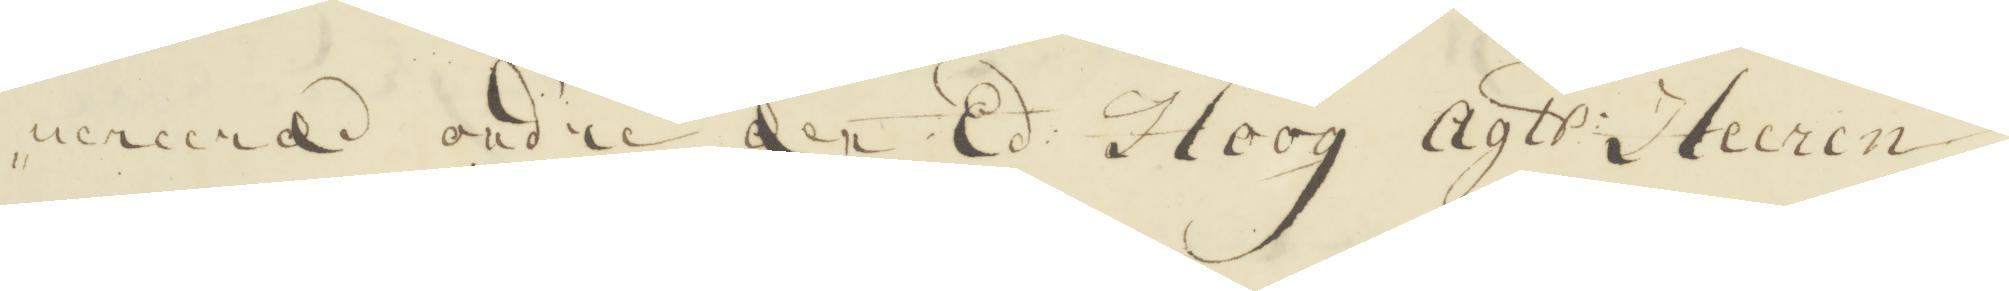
„nereerde ordre der Ed: Hoog Agtb: Heeren
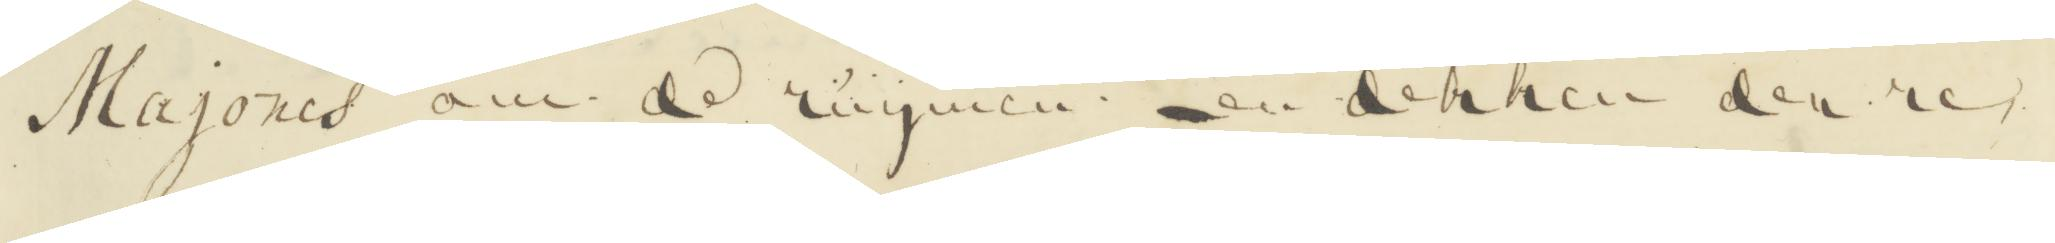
Majores om de ruijmen en dekken der re„
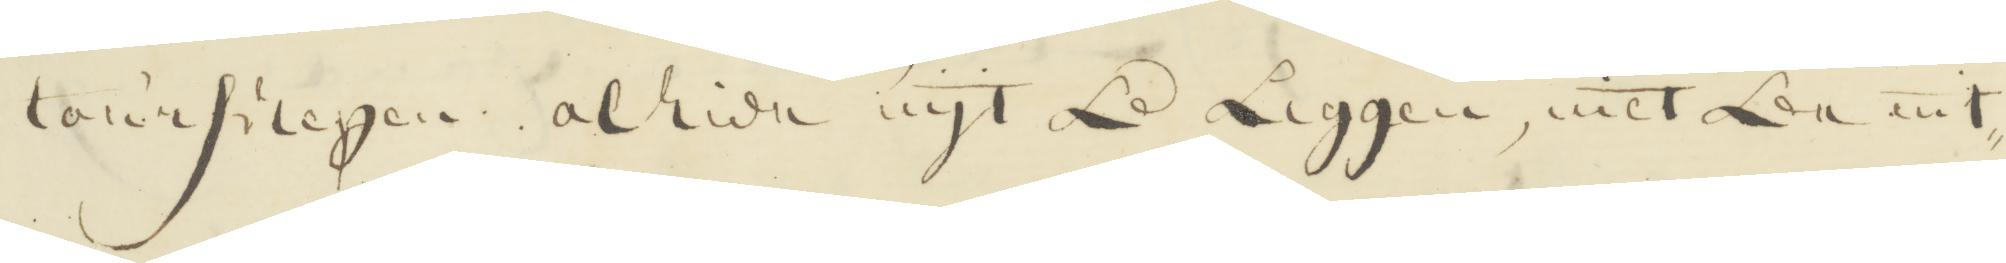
tourschepen alhier uijt te leggen, niet ter uit„
